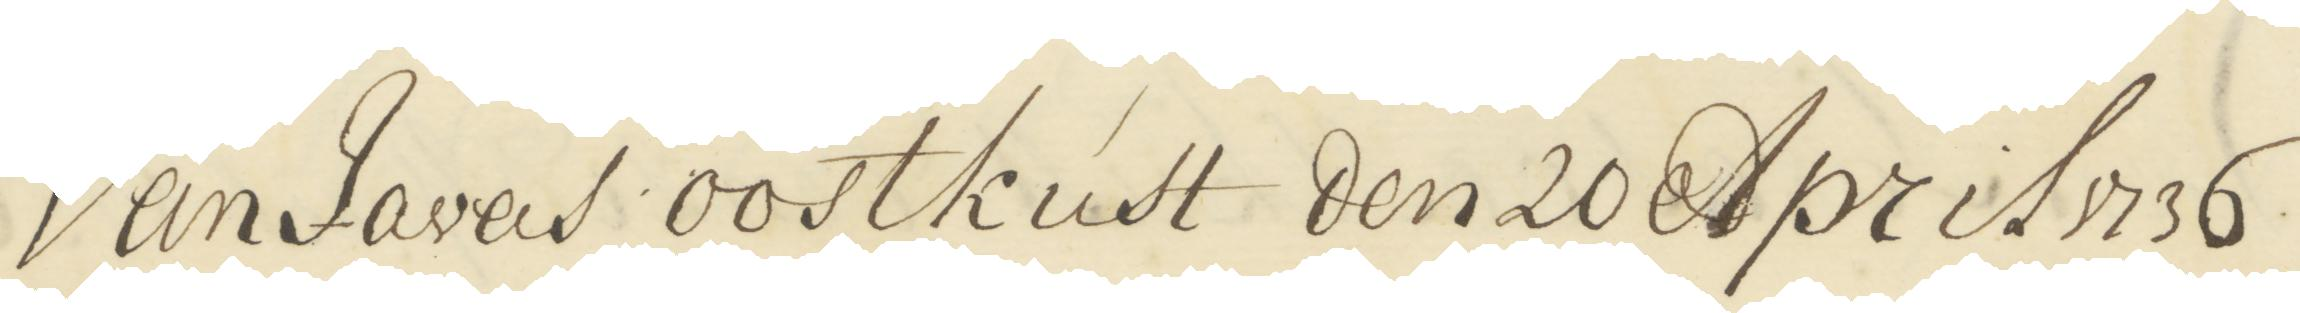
Van Iavas oostkust den 20 April 1736
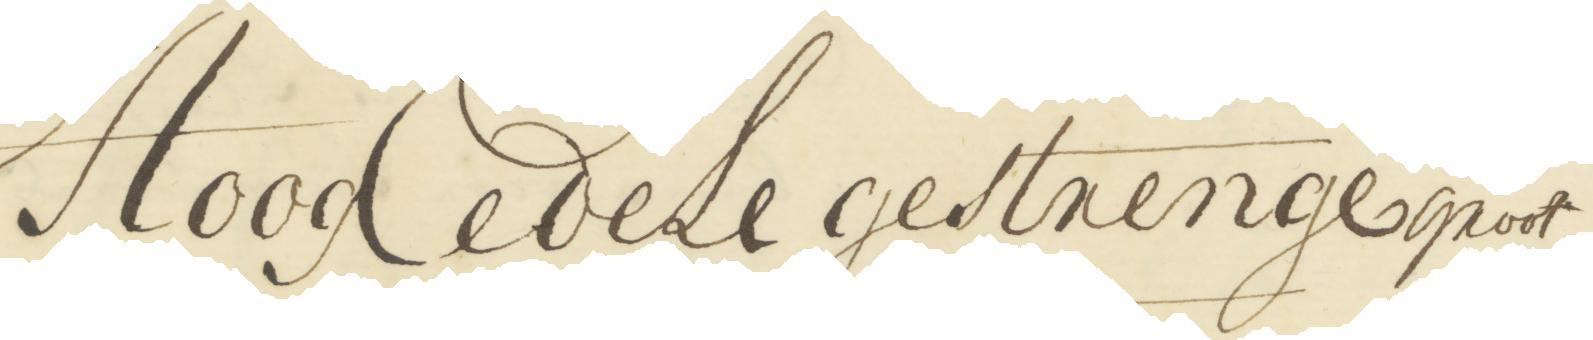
Hoog Eedele gestrenge groot
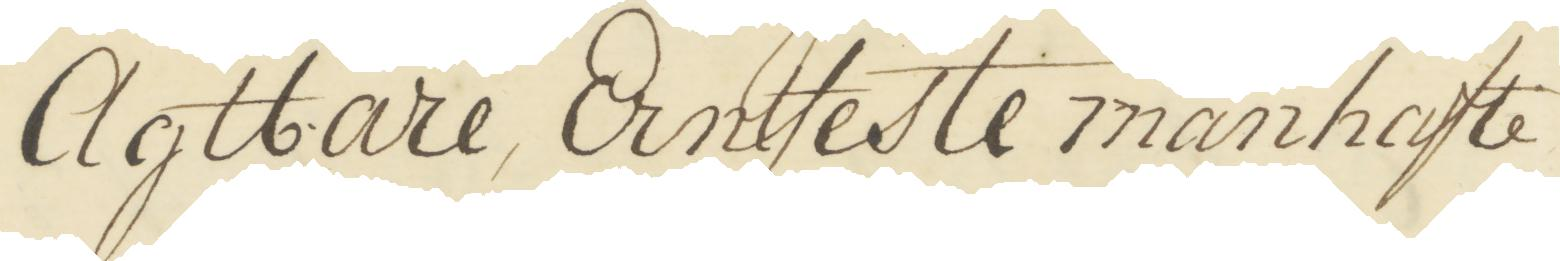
Agtbare, Erntfeste manhafte
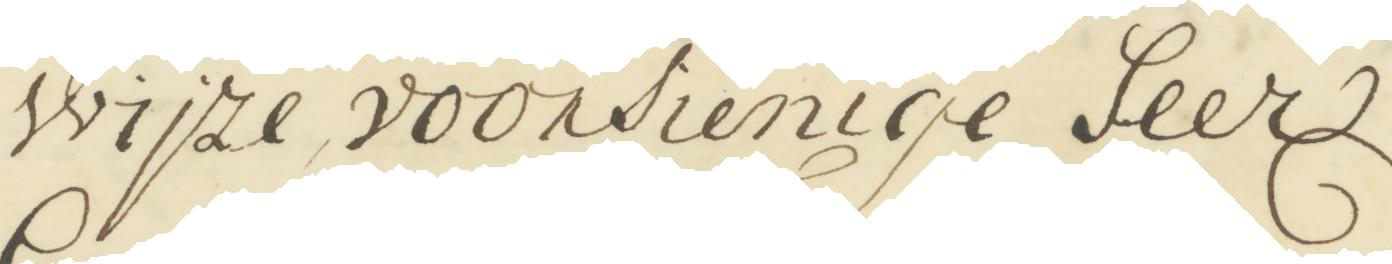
wijze, voorsienige seer
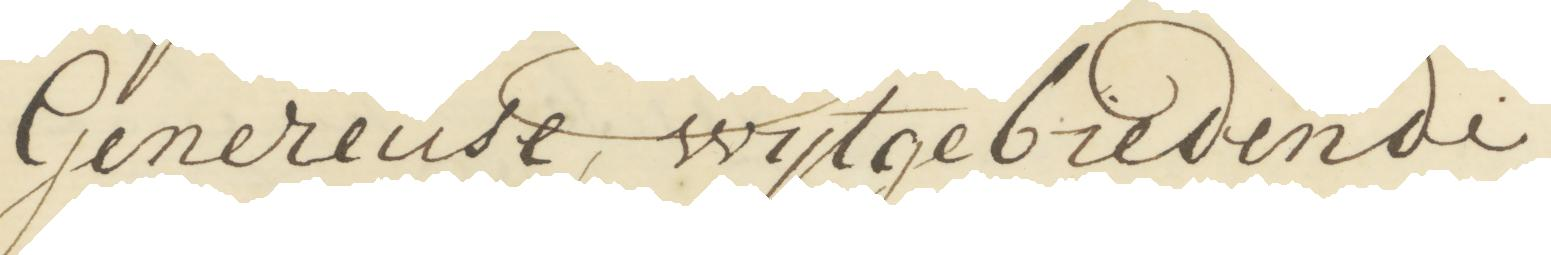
Genereuse, wijtgebiedende
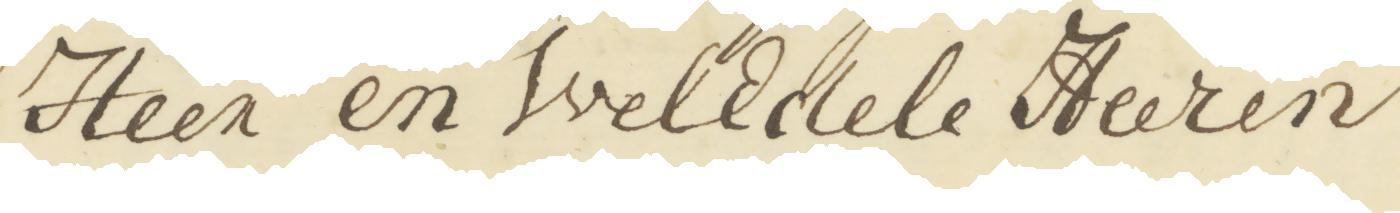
Heer en Wel Edele Heeren
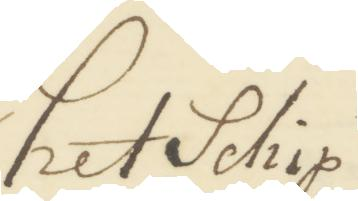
P„r het schip
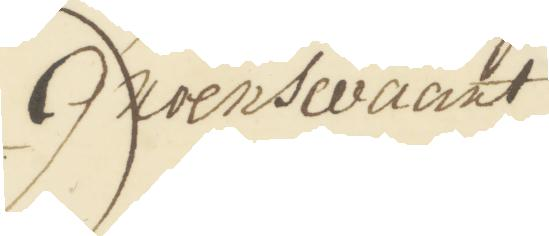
Groenswaart
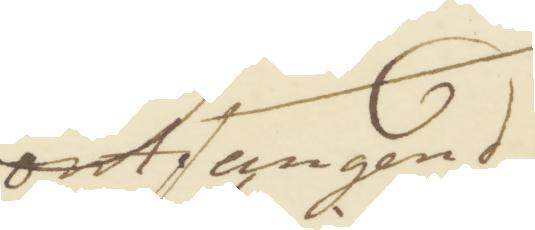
ontfangen d
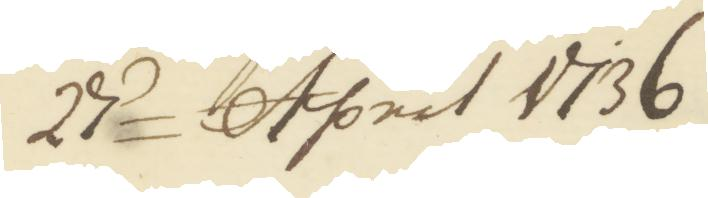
27=' April 1736
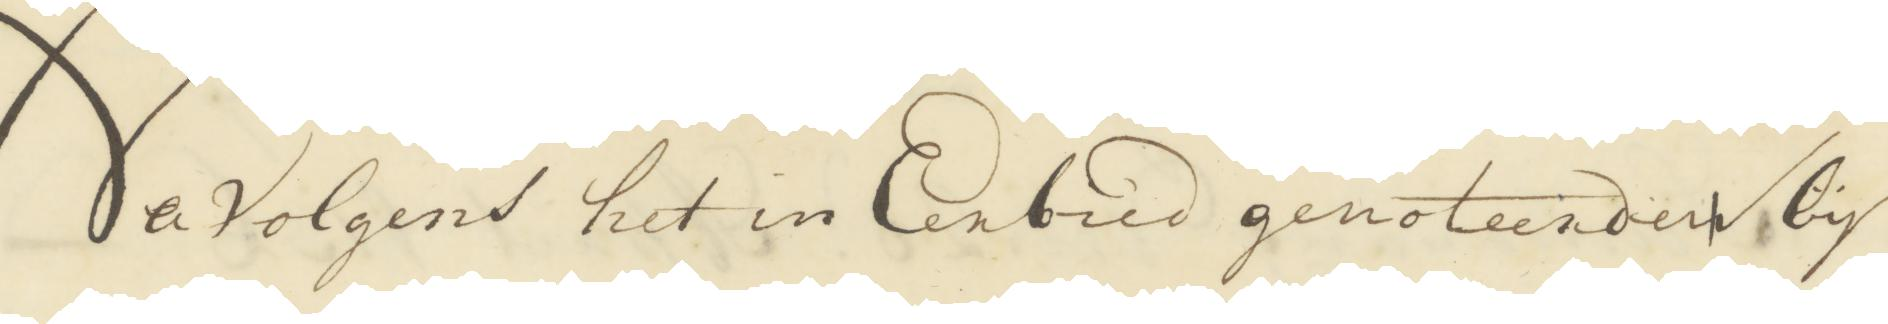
Na volgens het in Eerbied genoteerden bij
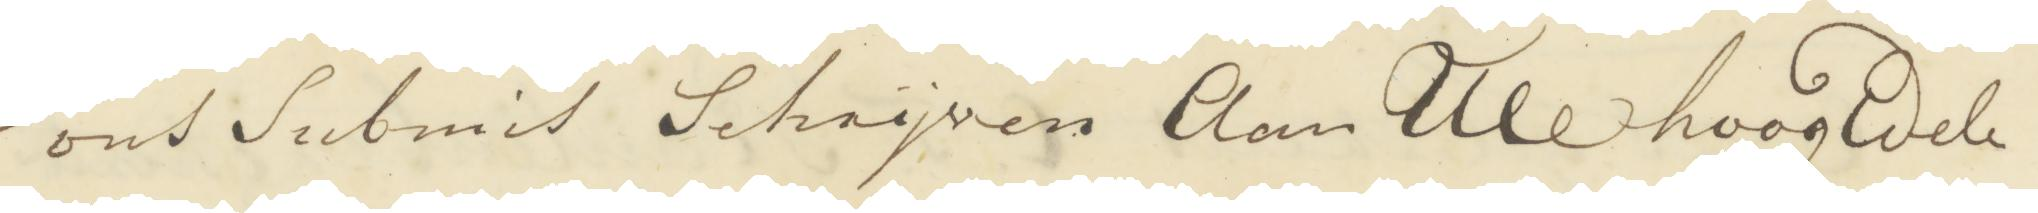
ons submis schrijven Aan Ule hoog Edele
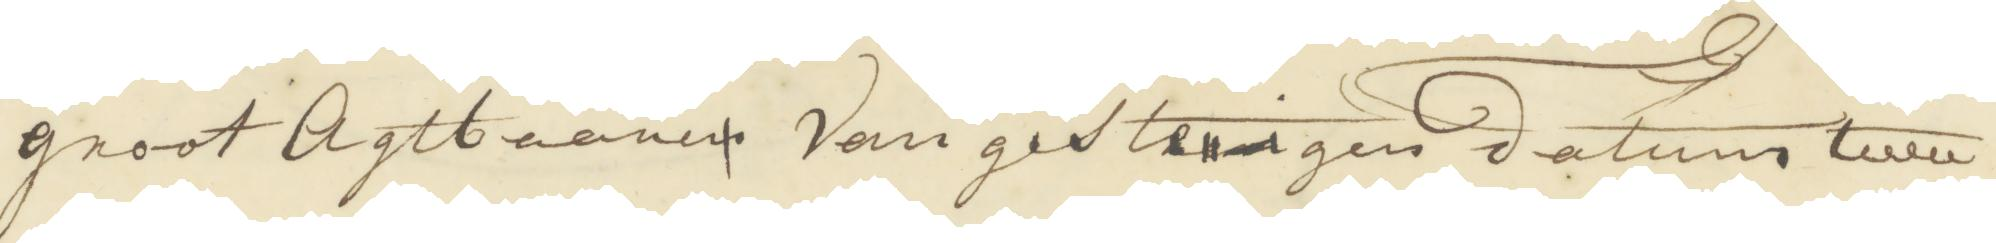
groot Agtbaaren van gisterigen datum twee
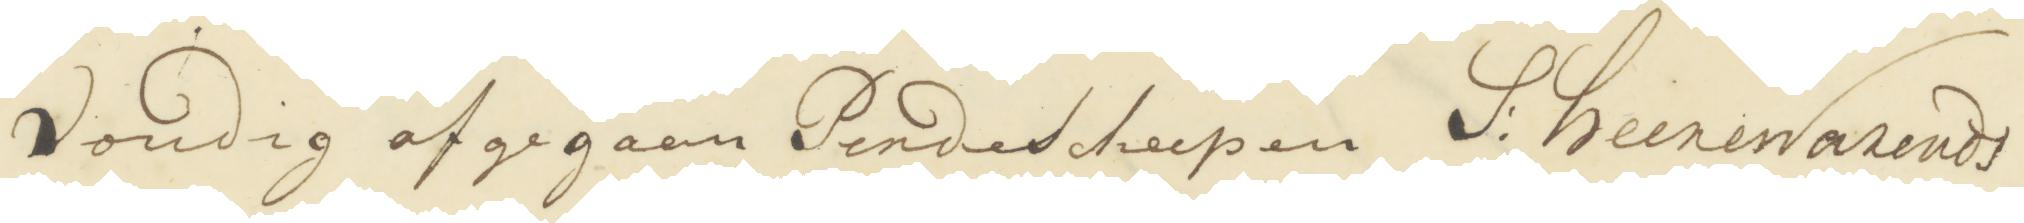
voudig afgegaen Perdescheepen S: Heeren arends
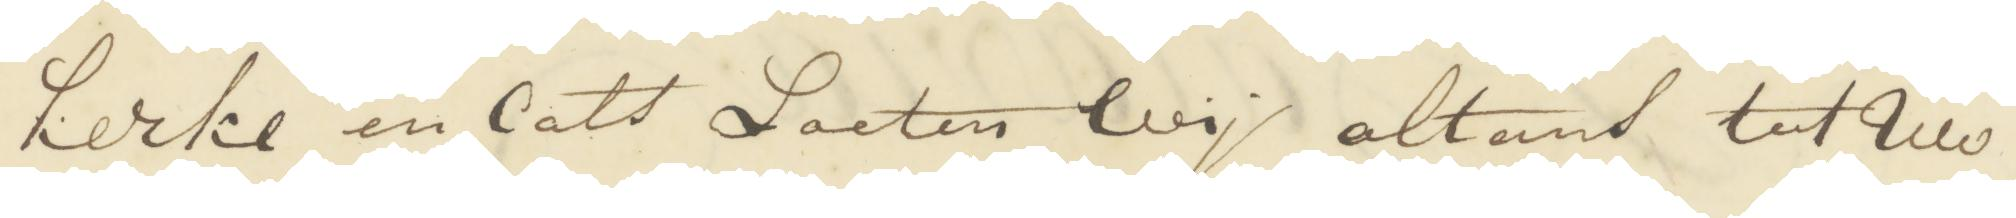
kerke en cats Laeten wij altans tot uw
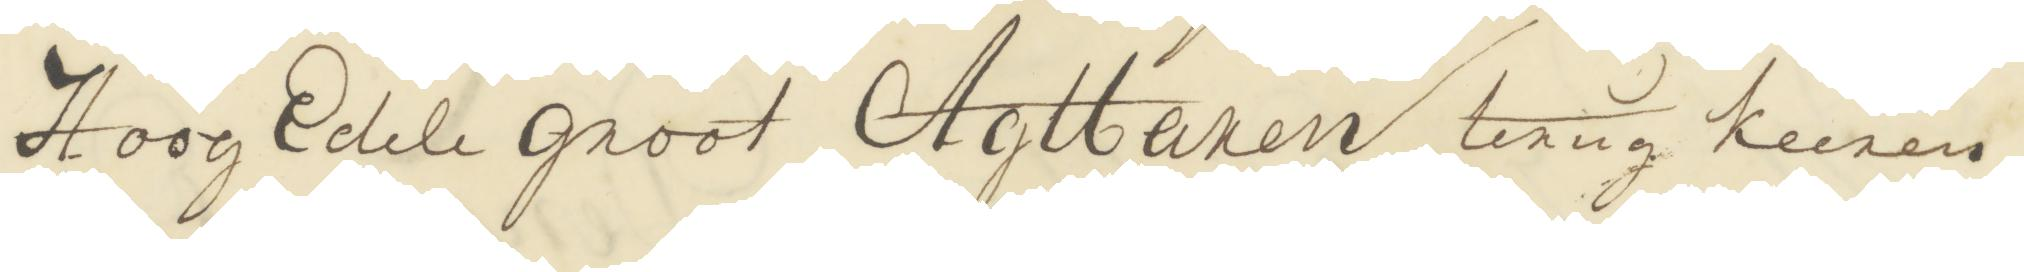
Hoog Edele groot Agtbaren terug keeren
